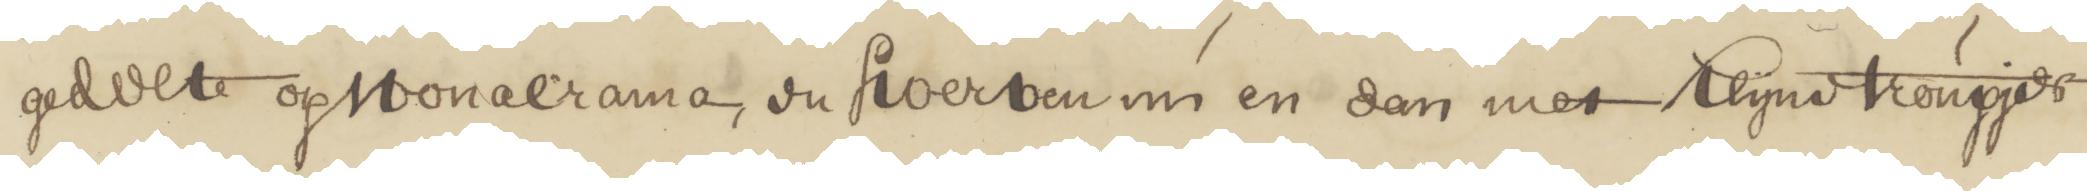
gedeelte opwonalrama, en swerven nu en dan met klijne troupjes
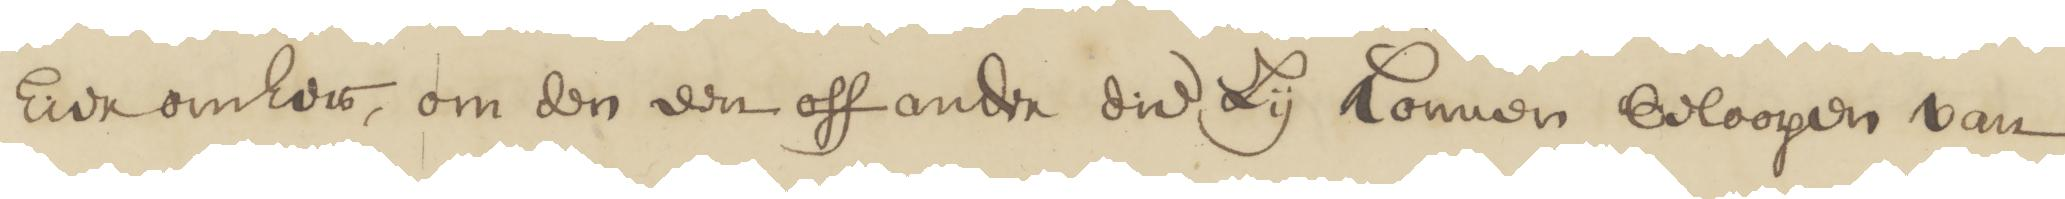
hier omher, om den een off ander die zij konnen beloopen van
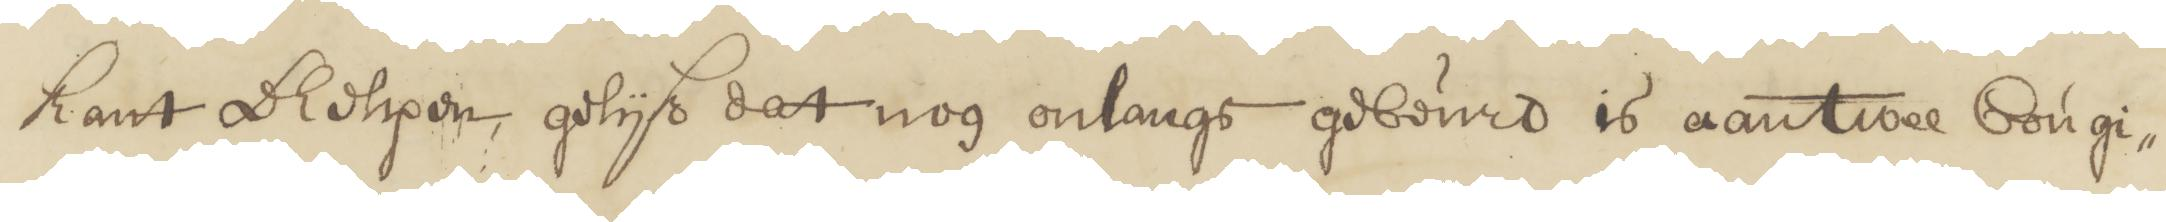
kant tehelpen, gelijk dat nog onlangs gebeurd is aantwee bougi„
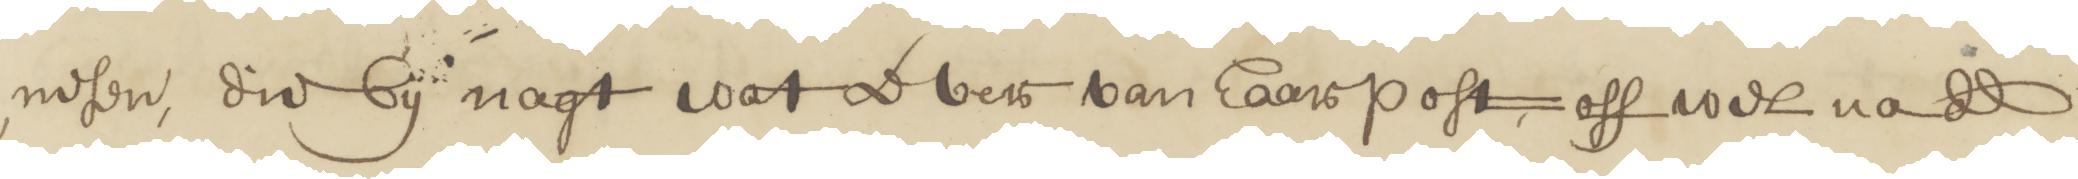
„nesen, die bij nagt wat te ver van haar post off wel na de
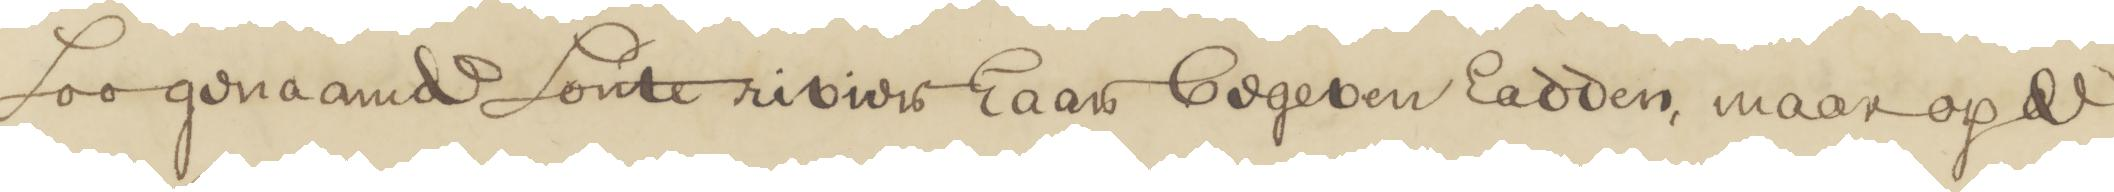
soo genaamde soute rivier haar begeven hadden, maar op de
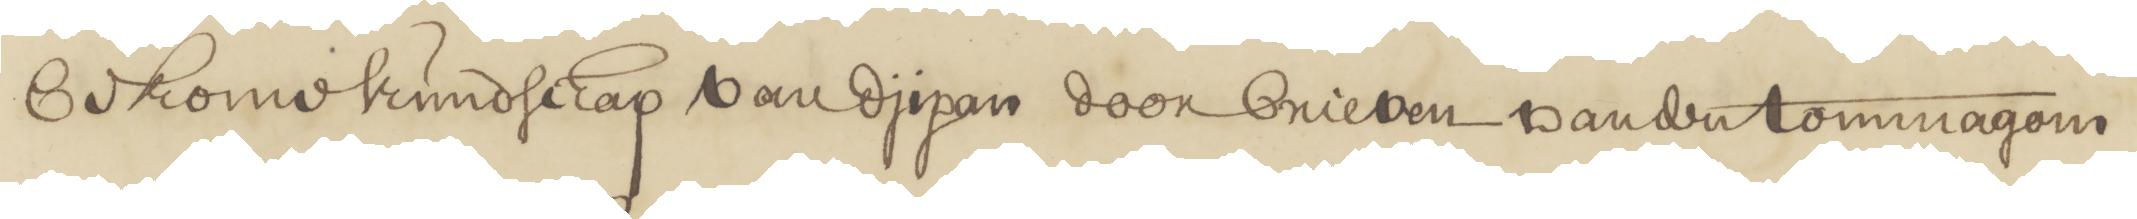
bekome kundschap van djipan door brieven van den tommagom
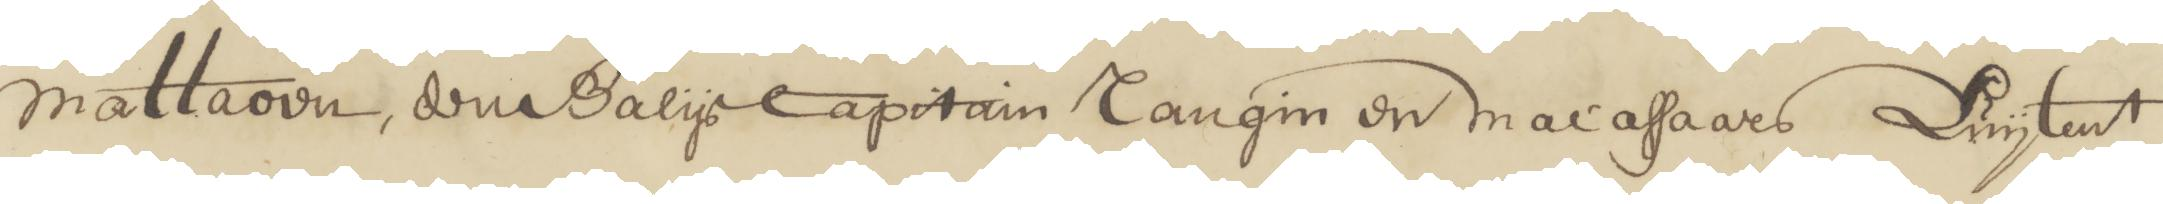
mattaoen, den Balijs capitain Rangin en macassaars luijtent
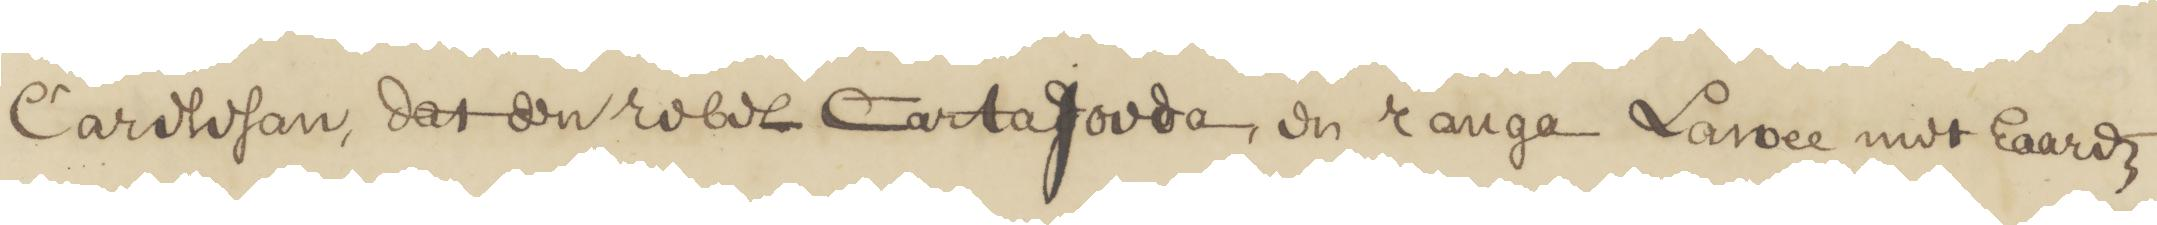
Carelesan, dat den rebel cartajoeda, en ranga lawee met haaren
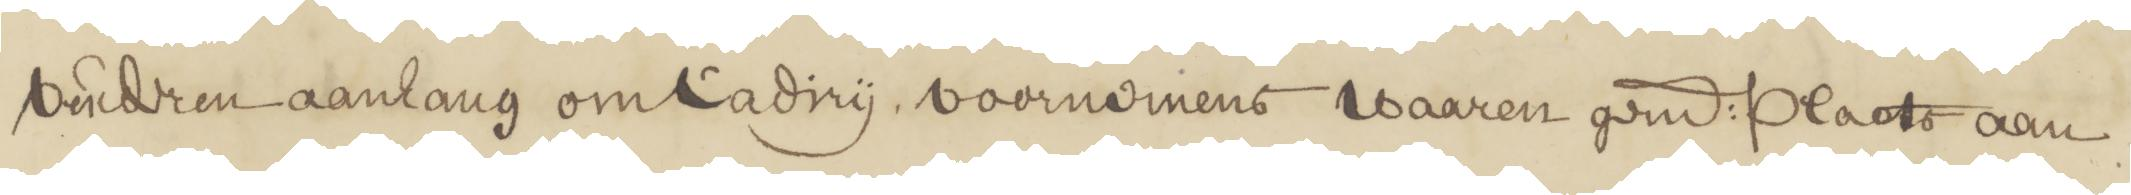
verderen aanhang om Cadirij voornemens waaren gem: plaats aan
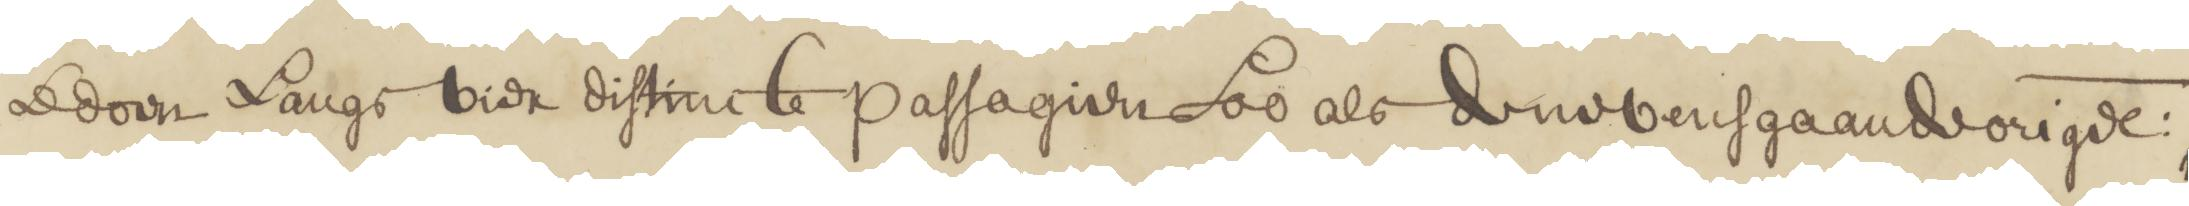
te doen langs vier distincte passagien soo als de nevens gaande origel:
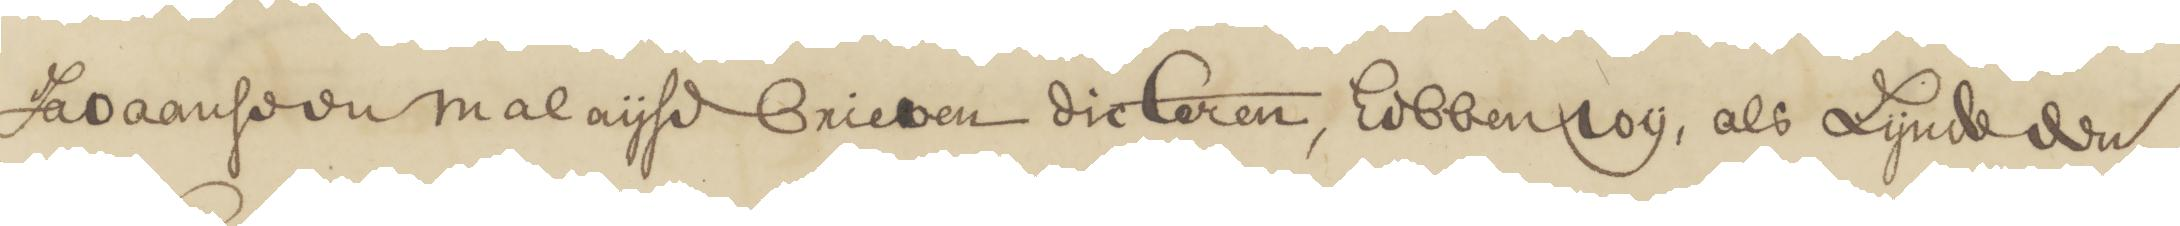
Javaanse en malaijse brieven dicteren, hebben wij, als zijnde een
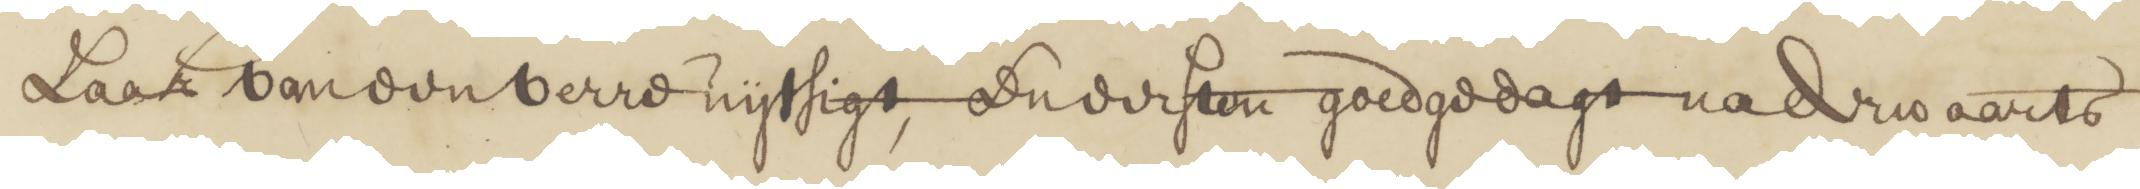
zaak van den verre uijtsigt, ten eersten goedgedagt na derwaarts
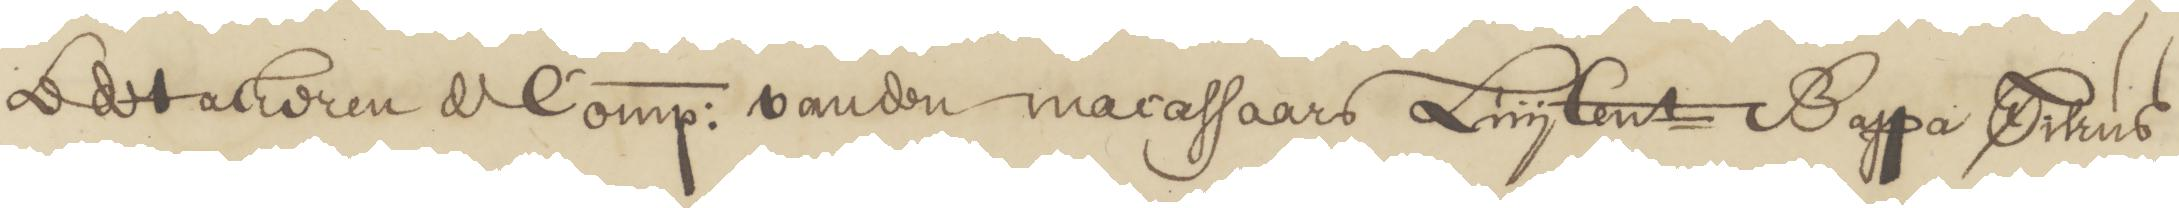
te detacheren de Comp: vanden macassaars luijten=t Bappa Pikus
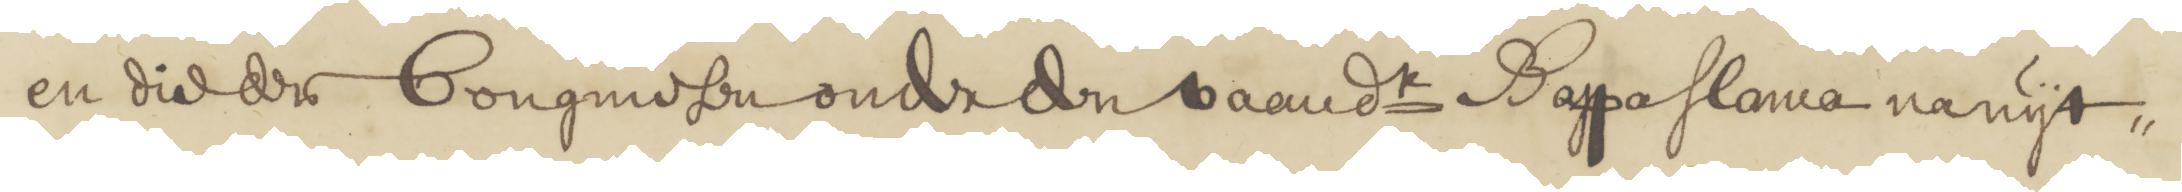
en die der bouginesen onder den vaand=r Bappaslama na uijt„
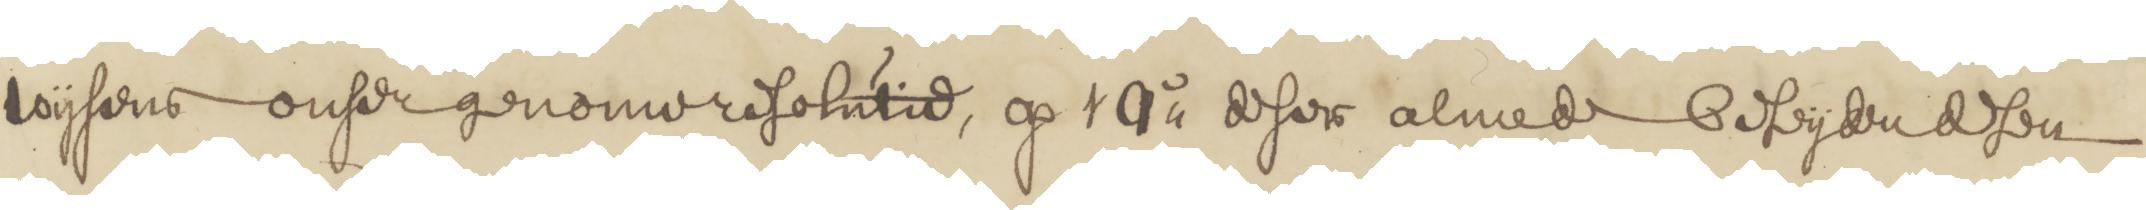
wijsens onser genome resolutie, op 14„e deser almede beseijden desen
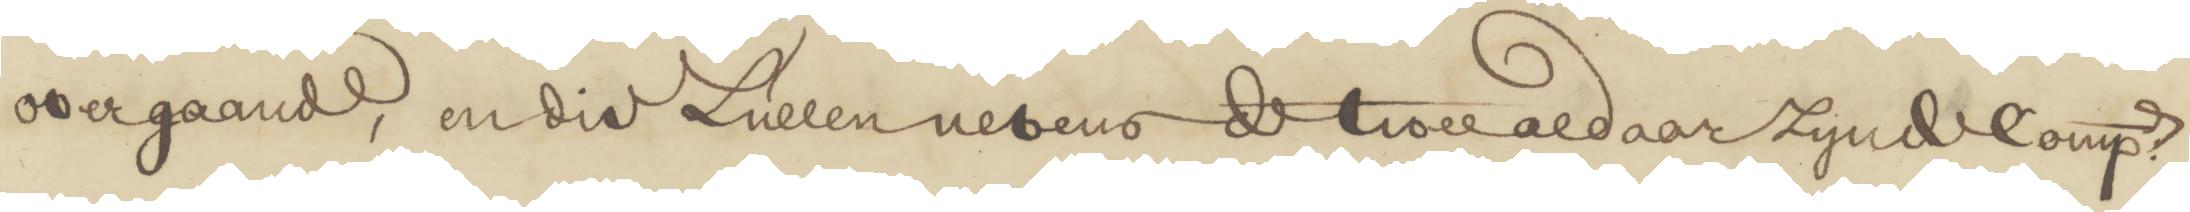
overgaande, en die zullen nevens de twee aldaar zijnde Comp:en
